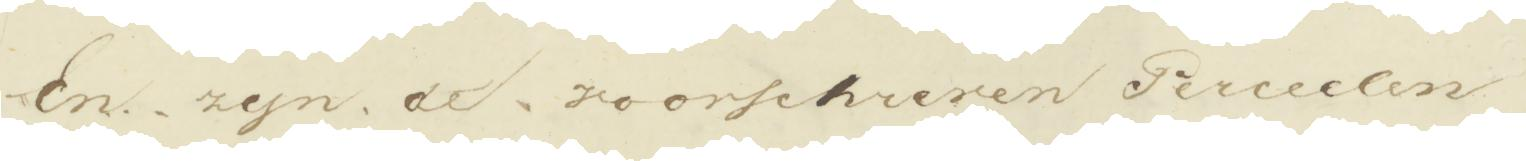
En zyn, de voorschreven Perceelen
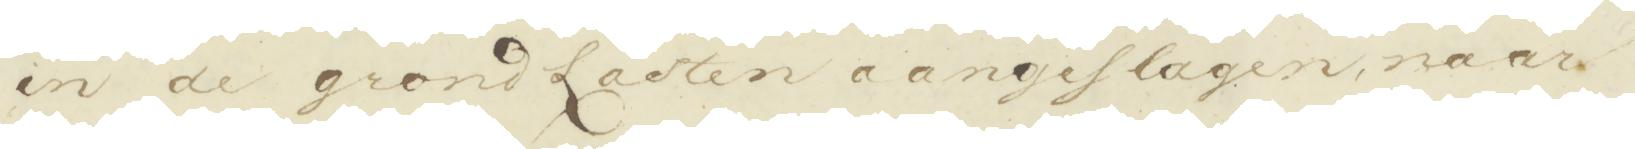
in de grond Lasten aangeslagen, naar
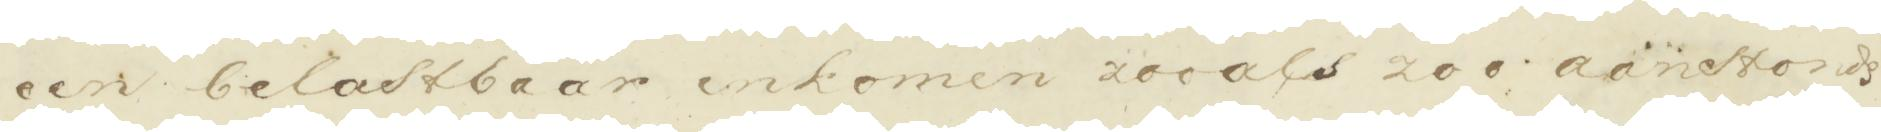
een belastbaar inkomen zoo als zoo aanstonds
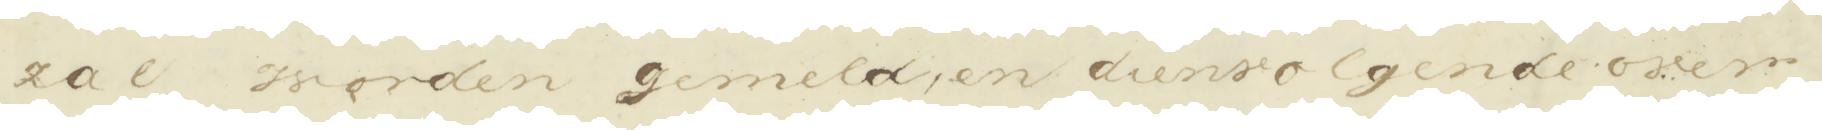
zal worden gemeld, en dienvolgende over
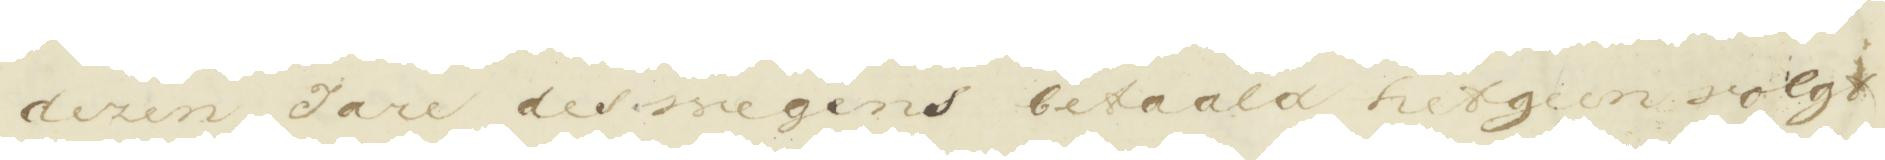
dezen Iare deswegens betaald hetgeen volgt
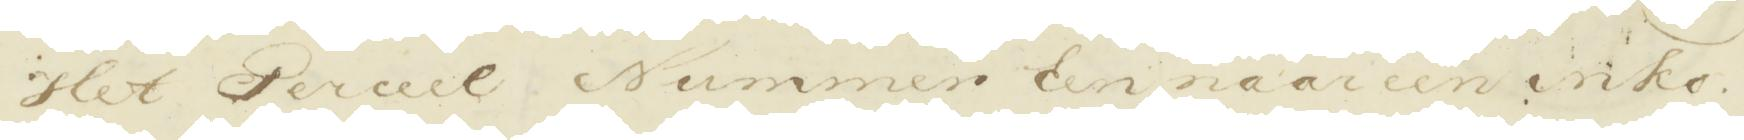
Het Perceel Nummer Een naar een Inko.
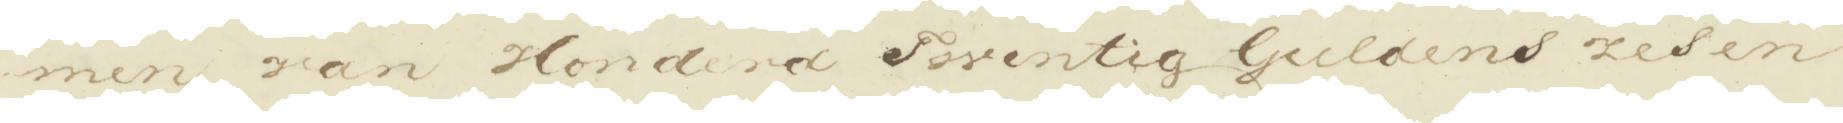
men van Honderd Twintig Guldens zes en
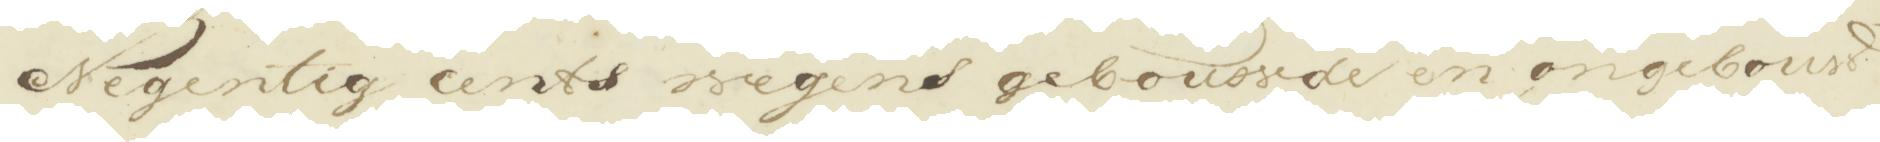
Negentig cents wegens gebouwde en ongebouw
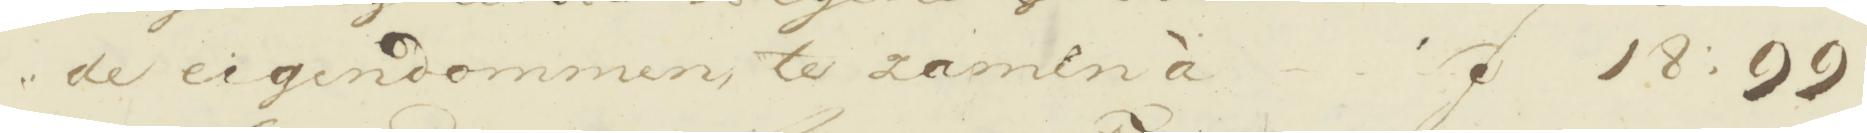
„de eigendommen, te zamen à - - f 18:99
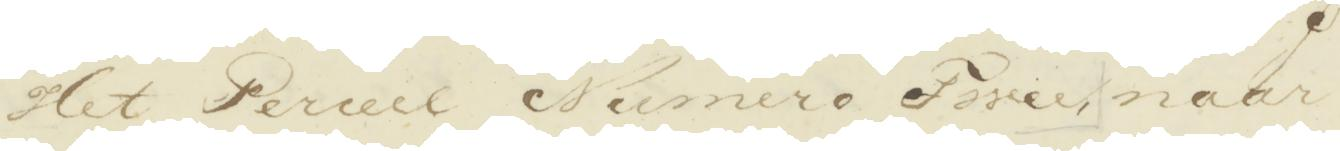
Het Perceel Numero Twee, naar
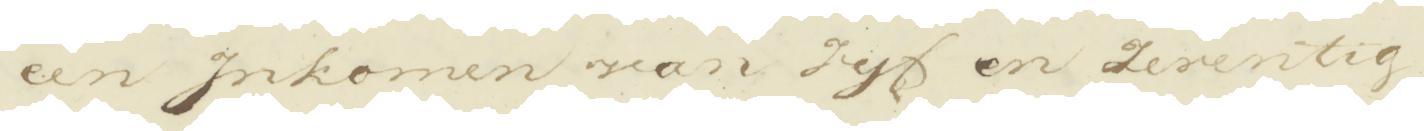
een Jnkomen van Vyf en zeventig
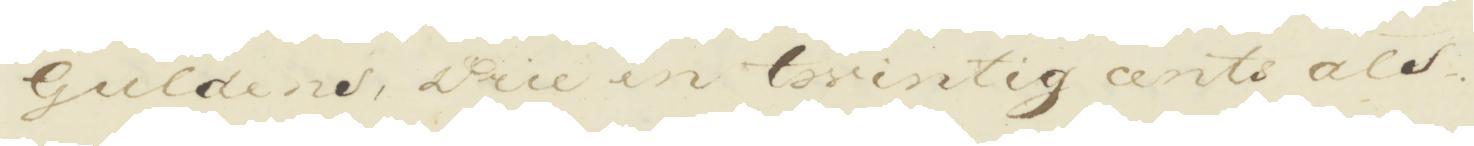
Guldens, Drie en twintig cents als
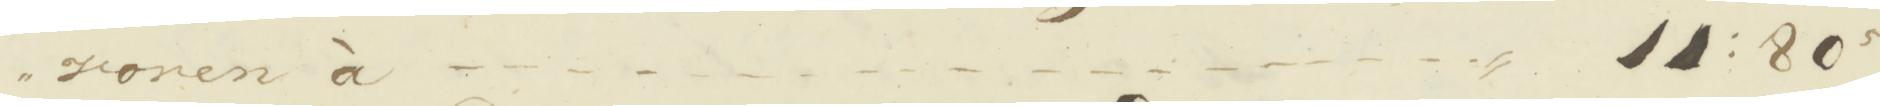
„voren à - - - - - - - - - - - - - - - - - .„11:805
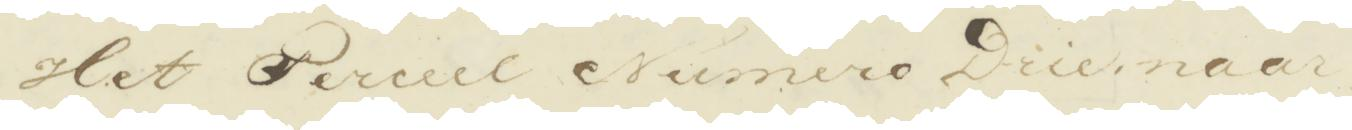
Het Perceel Numero Drie, naar
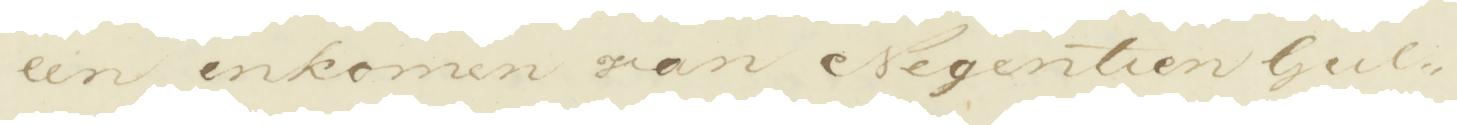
een inkomen van Negentien Gul„
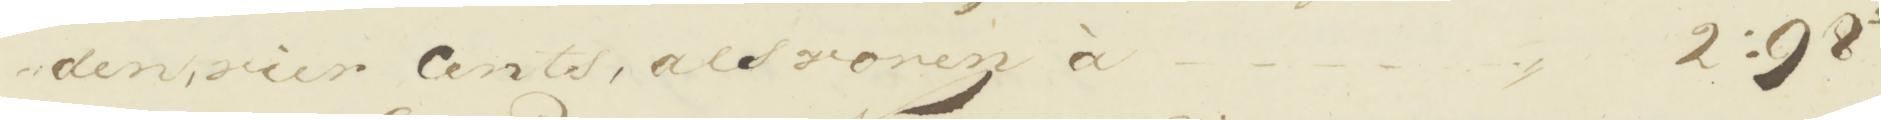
„den, vier Cents, als voren à - - - - - .„ 2:985
